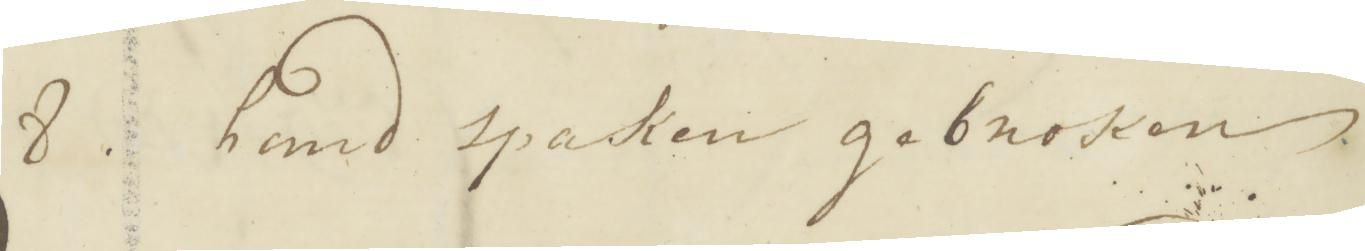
8. hand spaken gebroken
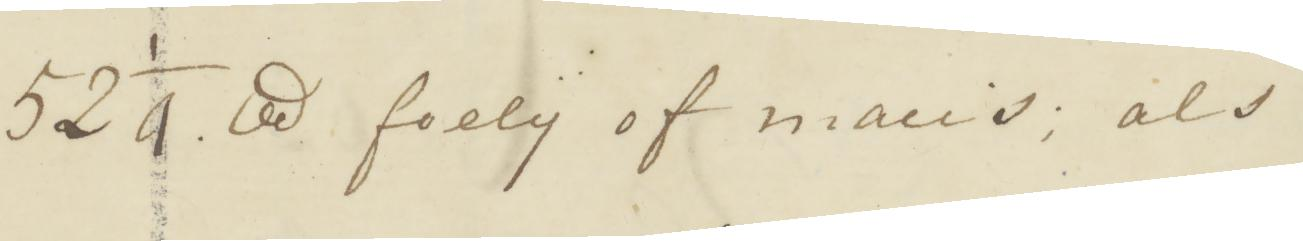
52 1/4. lb foelij of macis: als
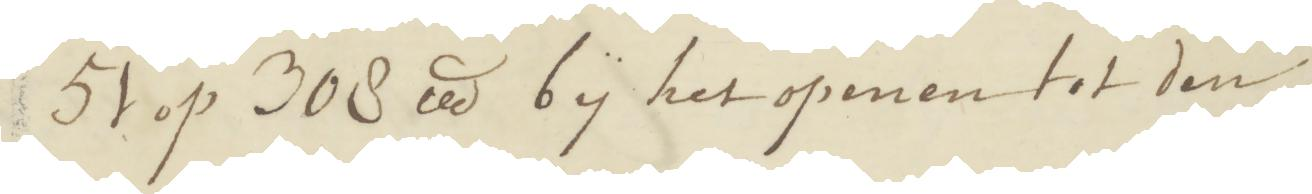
51 op 308 lb bij het openen tot den
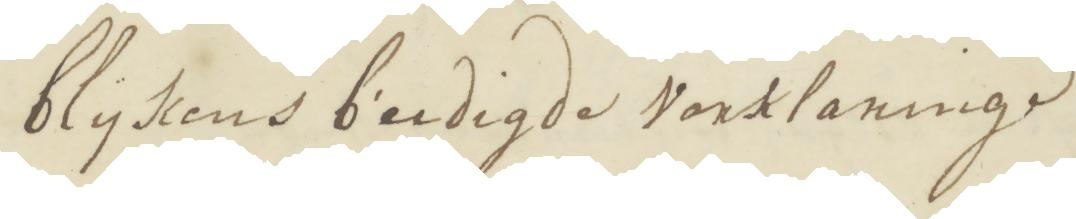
blijkens b'eedigde verklaninge
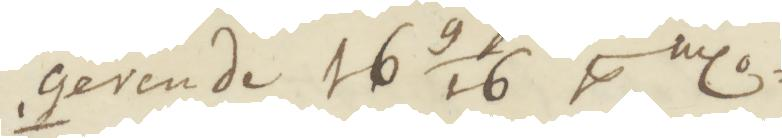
gevende 16 9/16 p:r C:o
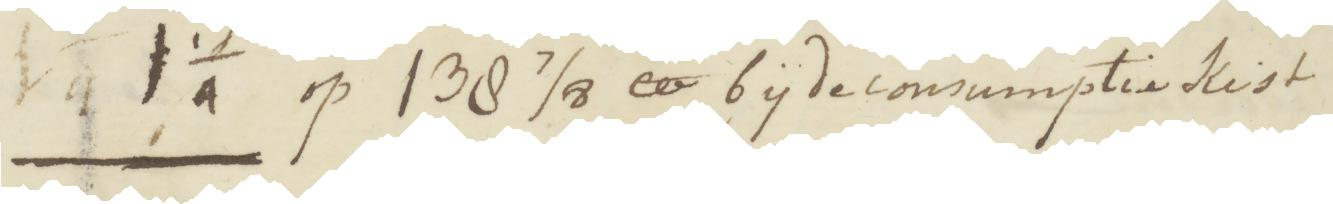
1 ¼ op 138 7/8 lb bij de consumptie kist
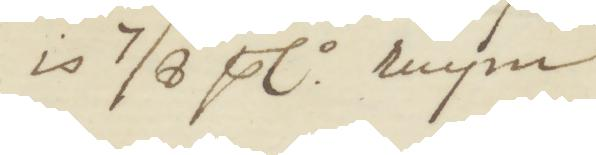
is 7/8 pC:o ruym
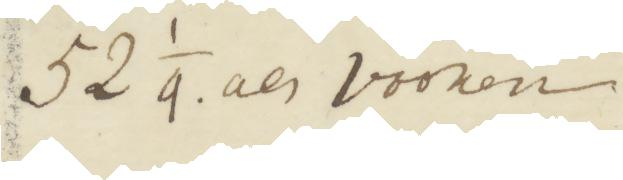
52 ¼. als vooren
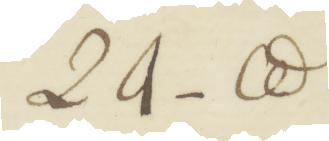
24 — lb
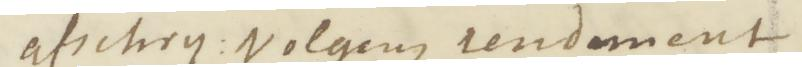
afschrij: volgens rendement
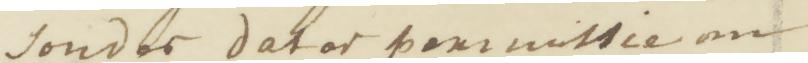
sonder dat er permissie om
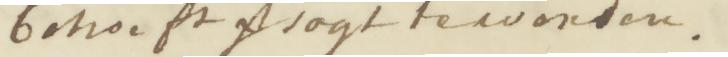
behoeft versogt te worden.
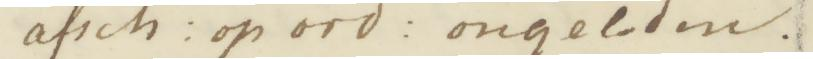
afsch: op ord: ongelden.
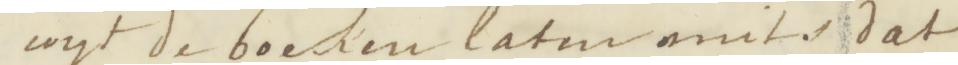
uijt de boeken laten mits dat
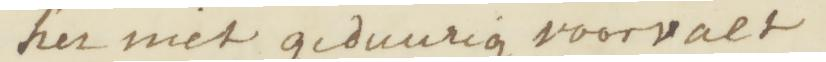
het niet geduurig voorvalt
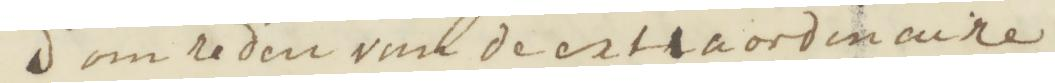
d:o om reden van de extra ordinaire
